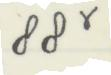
885
